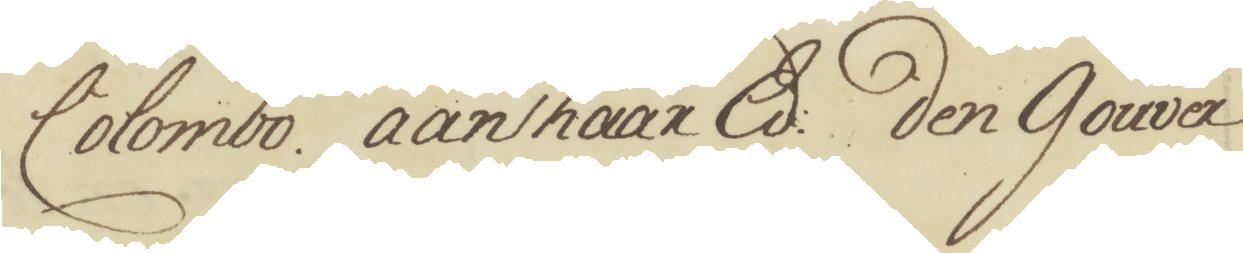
Colombo. aan haar Ed: den Gouver
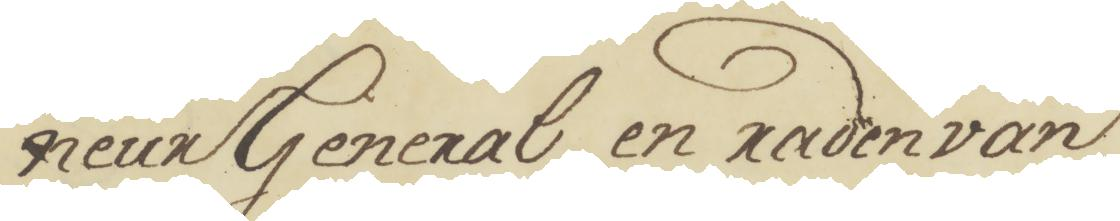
neur General, en raden van
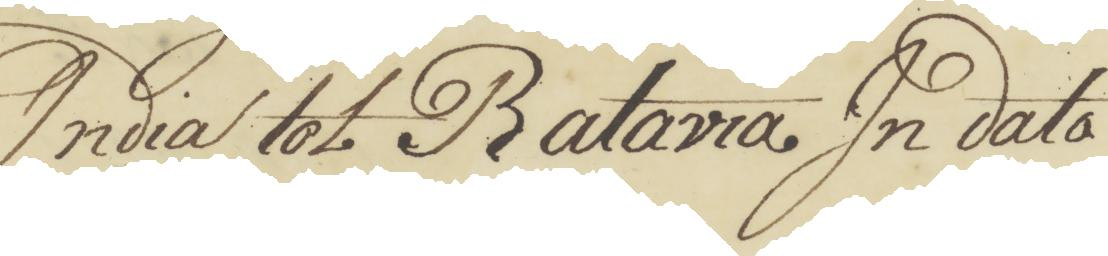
Jndia tot Batavia Jn dato
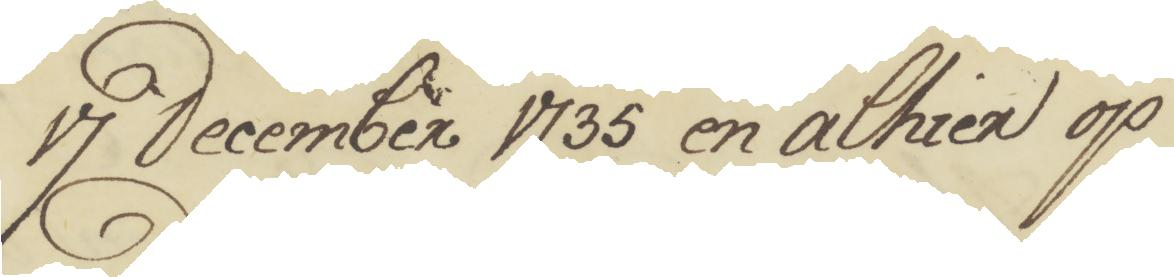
17 december 1735 en alhier op
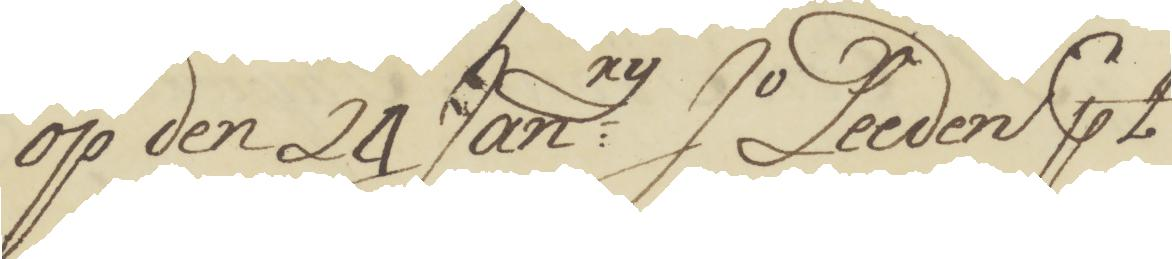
op den 24 Jan:ry J:o Leeden pt
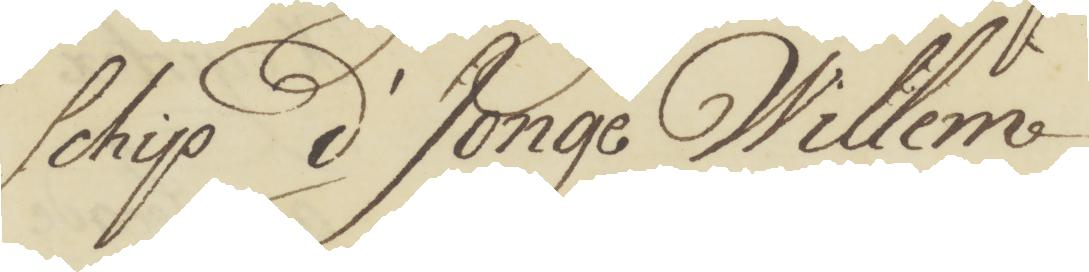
schip d’ Jonge Willem
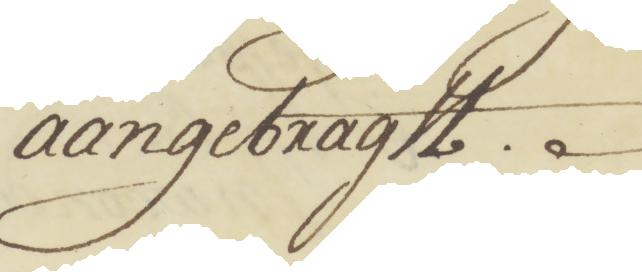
aangebragtt.
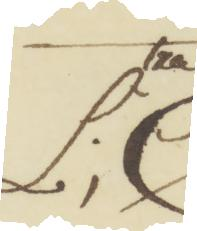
Ltra; E
